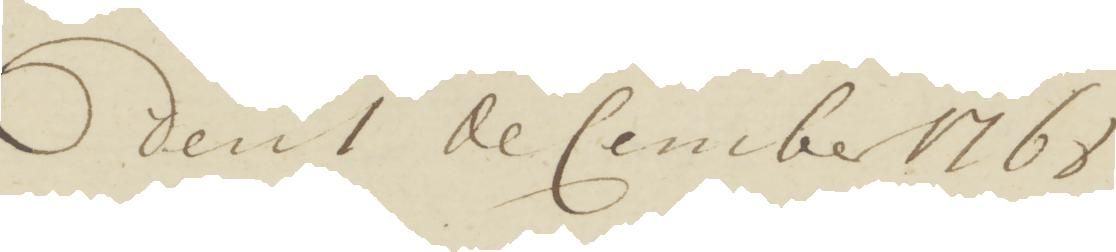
den 1 december 1768
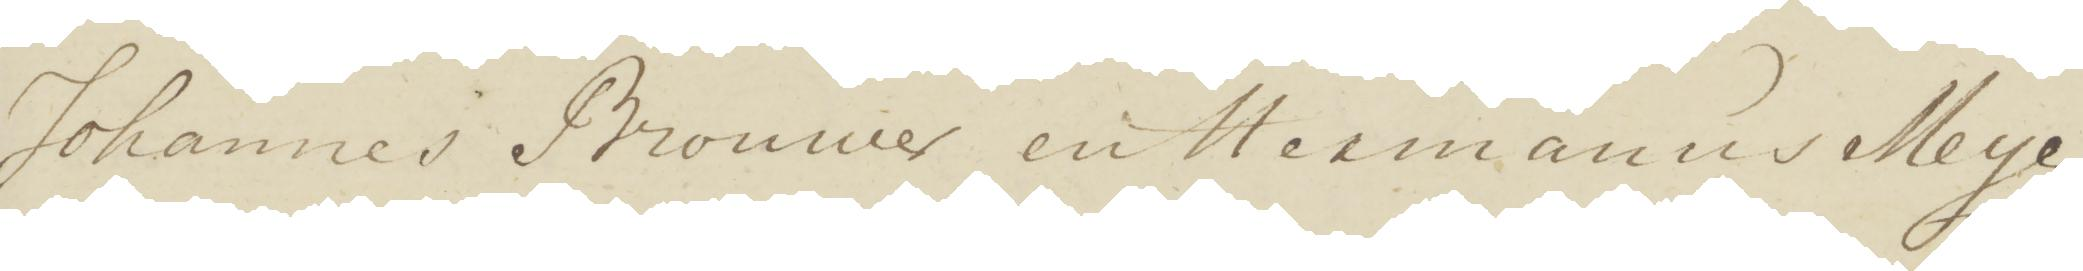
Johannes Bronnier en Hermanus Meye
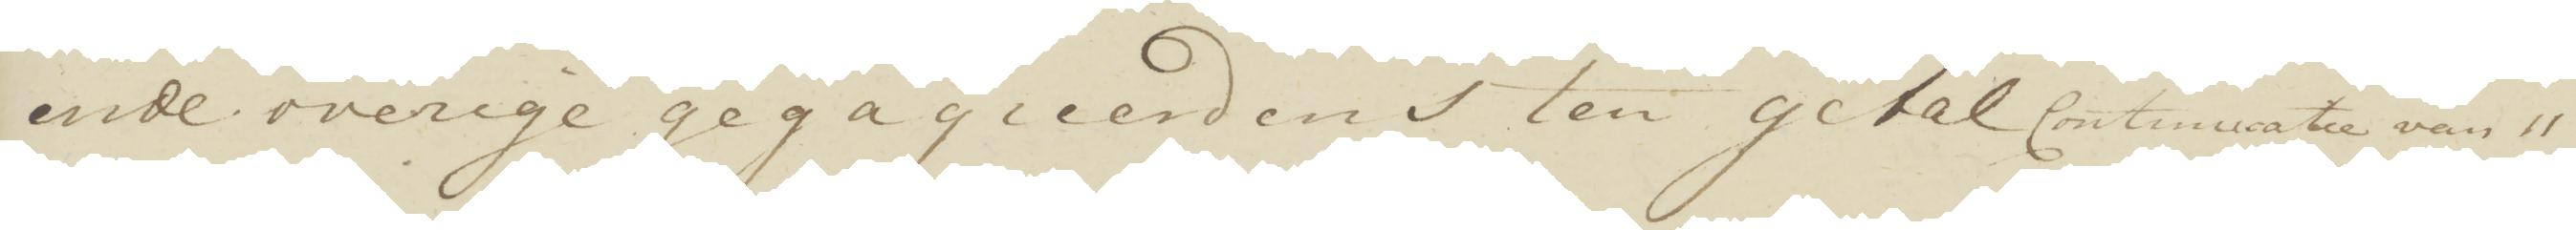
ende overige gegagieerdens ten getal cotinucatie van 11
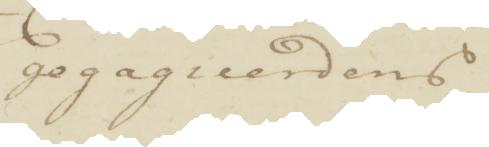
gegagieerdens
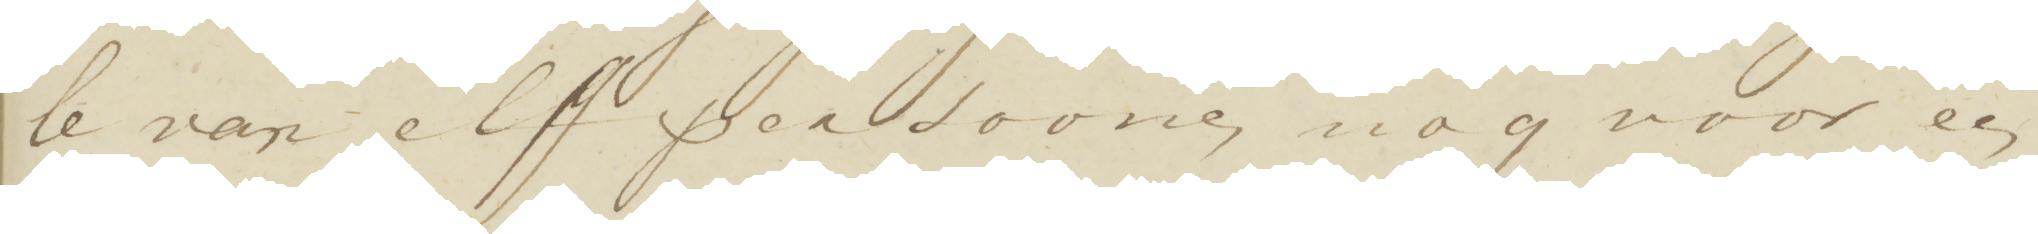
le van elff persoonen nog voor een
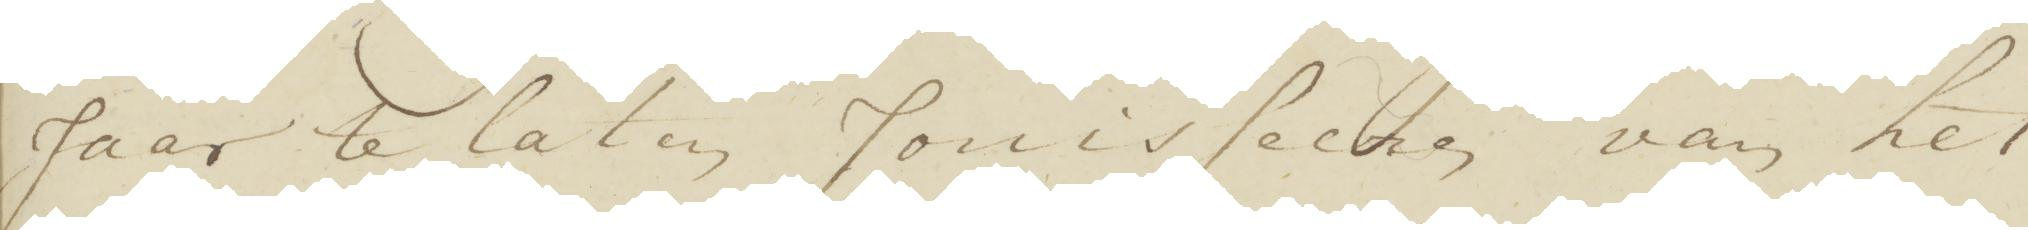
Jaar te laten Jonisseeren van het
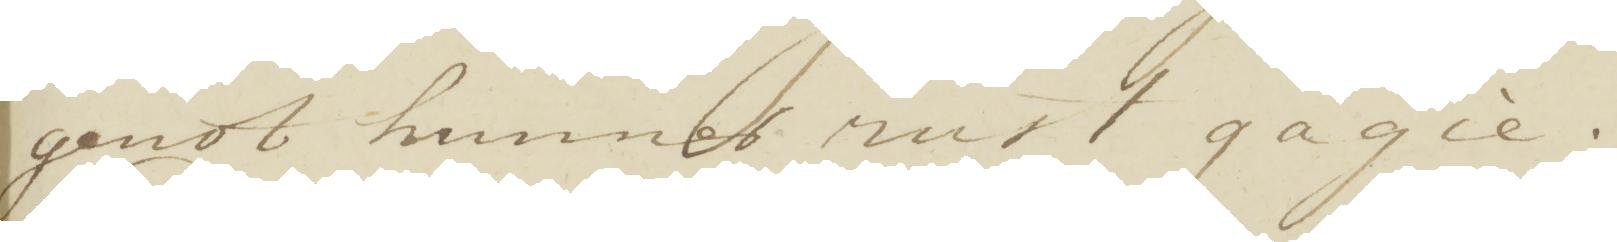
genot hunnes rust gagie.
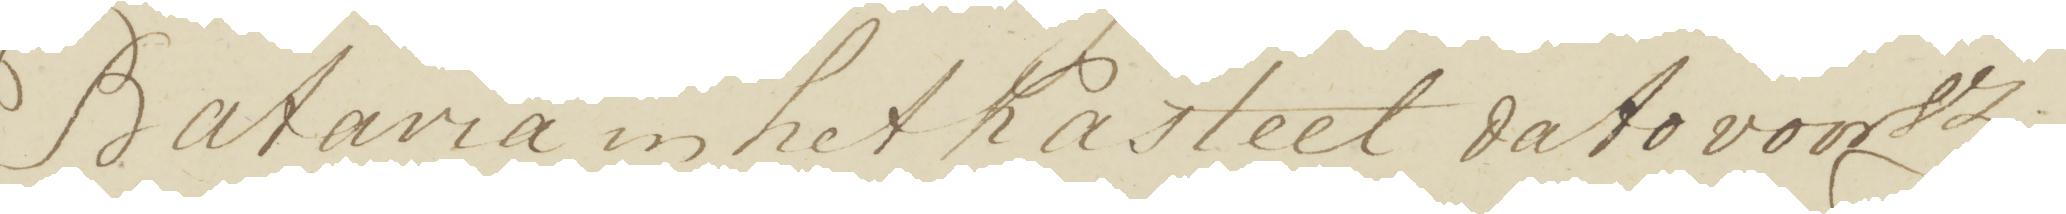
Batavia in het Kasteel dato voorsz:
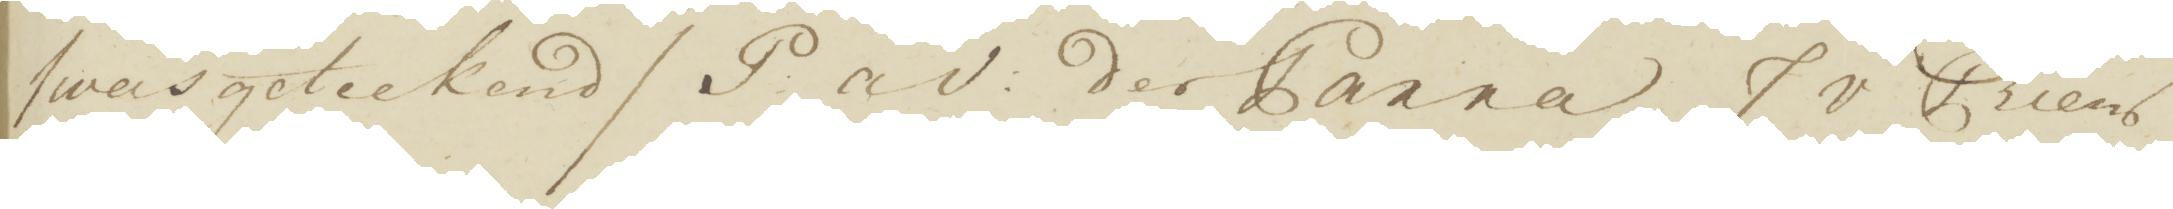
/was geteekend/ T: a v: der Parra J v Biens
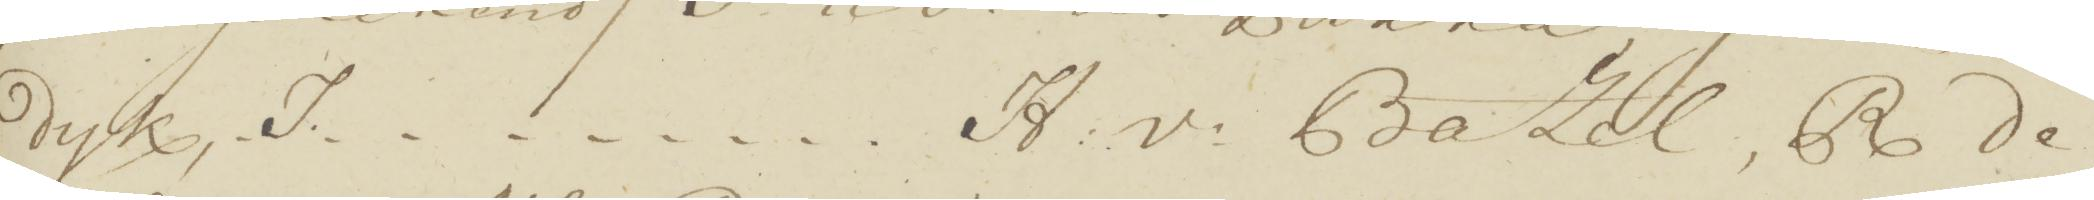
dyk, - J. - - - - - - - - H: v: Bazel, R de
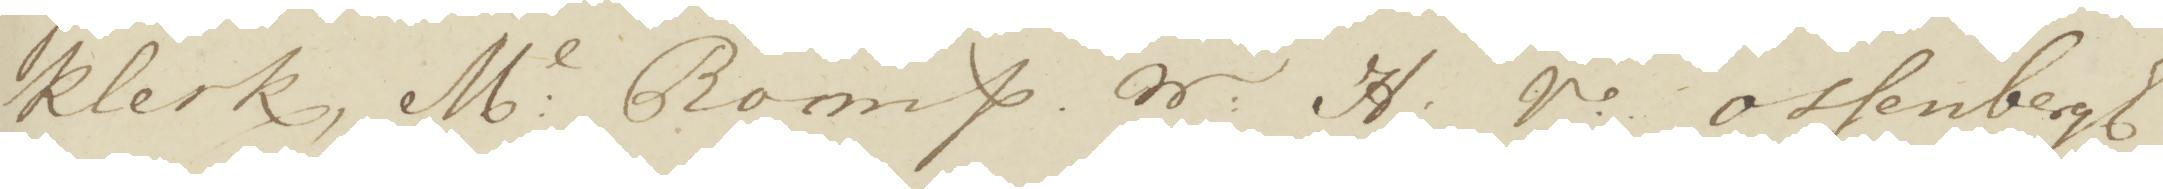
klerk, M:e Romp. w: H: v. ossenbergh
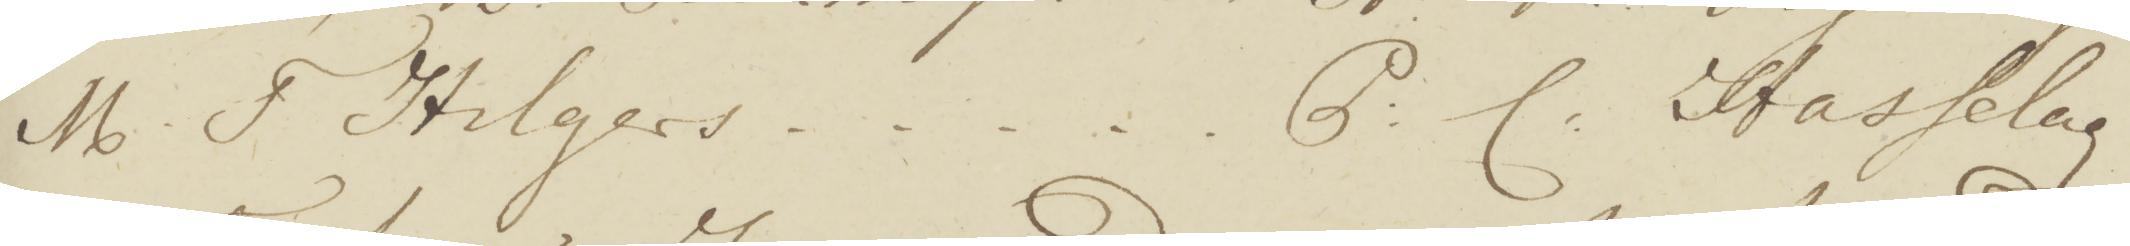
M. T Hilgers - - - - - P: C: Hasselag
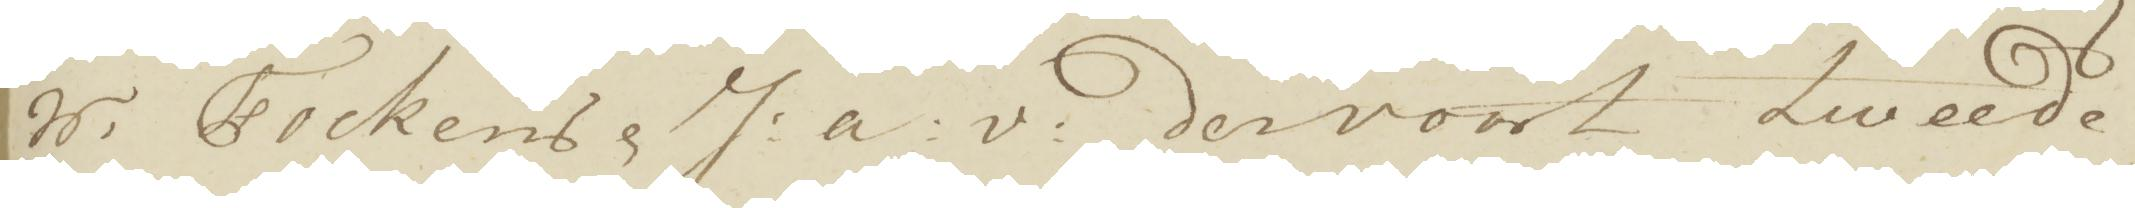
W: Fockens en J: a: v: dervoort tweede
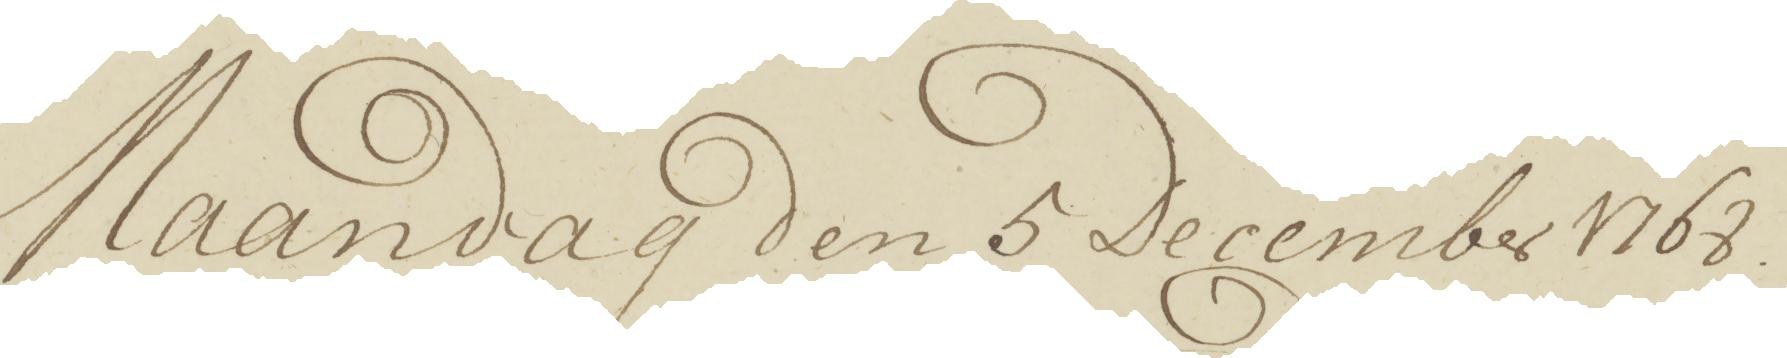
Maandag den 5 December 1768.
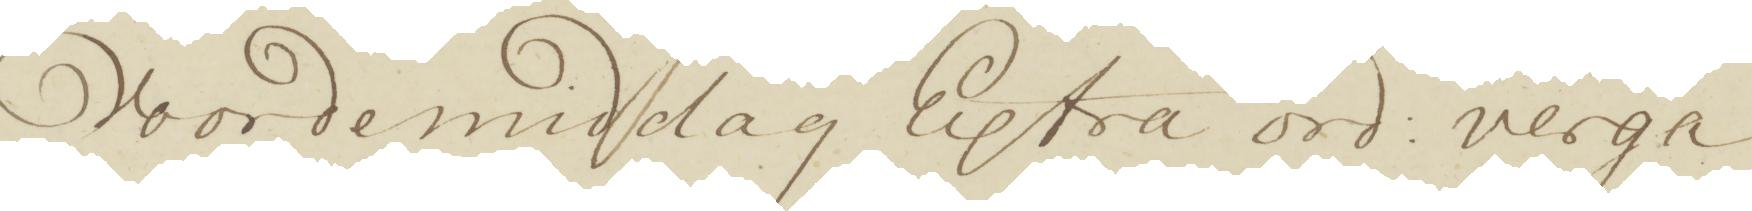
voor de middag Extra ord: verga
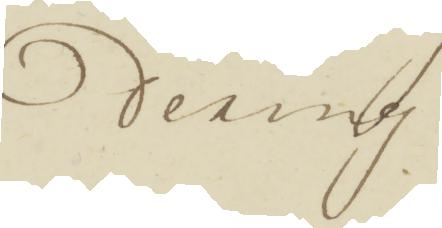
dering
